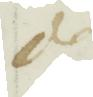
d_o
